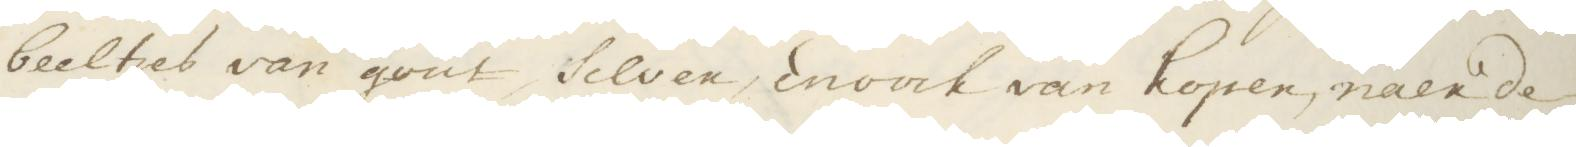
beeltjes van gout, silver, En oock van koper, naer de
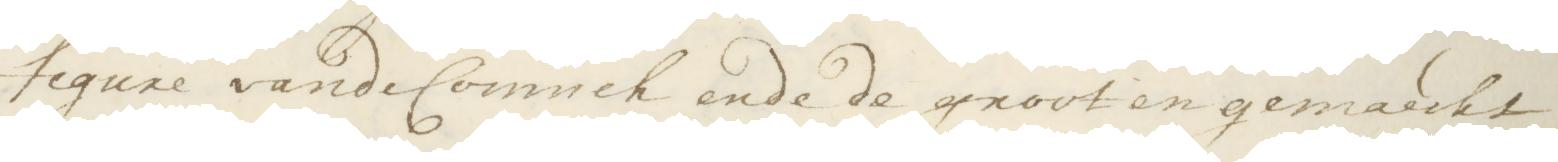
figure vande Coninck ende de groot en gemaekt
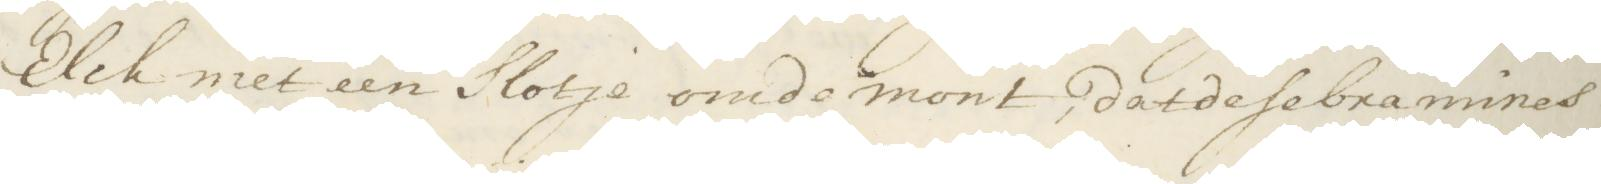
Elck met een slotje om de mont, dat dese bramines
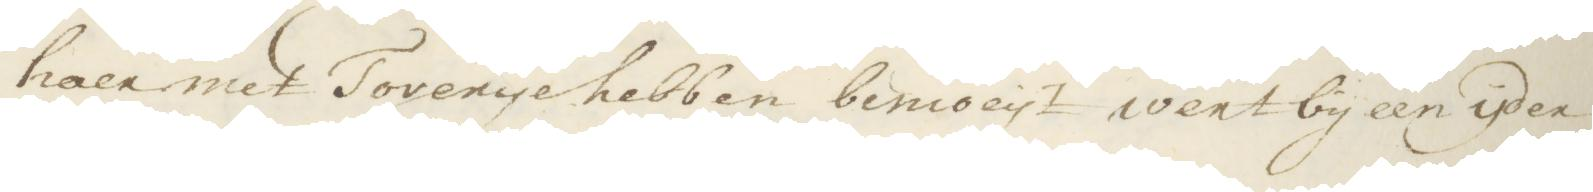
haer met Toverije hebben bemoeijt wert bij een ijder
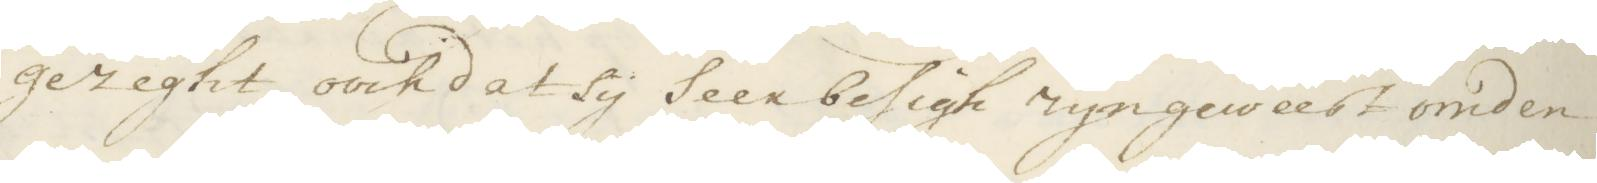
gezeght, oock dat sij seer besigh zijn geweest om den
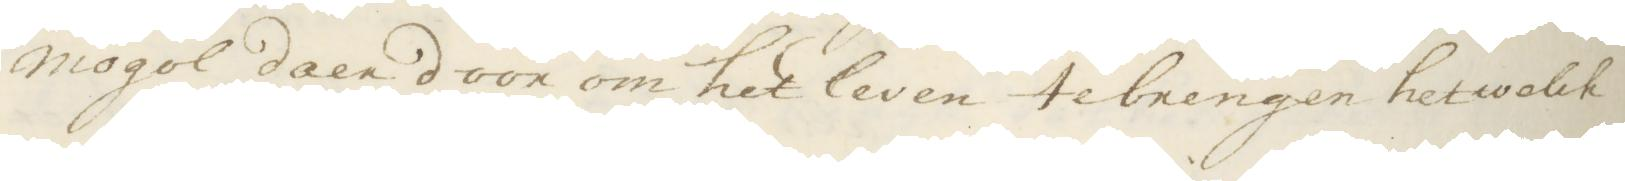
mogol daer door om het leven te brengen hetwelck
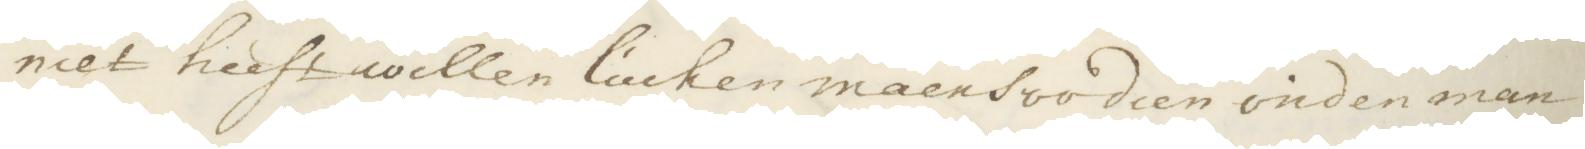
niet heeft willen lucken maer soo dien enden man
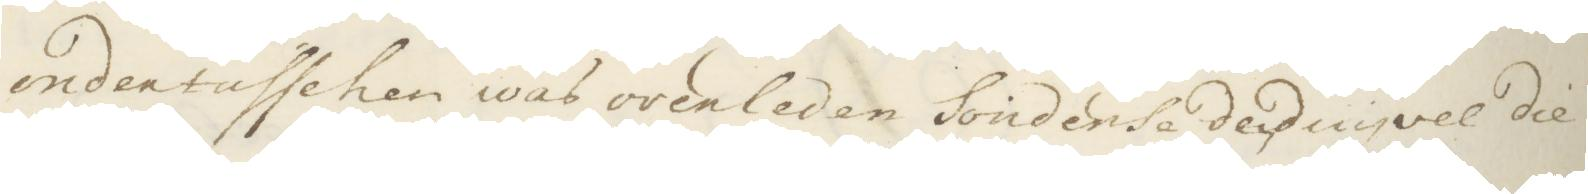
ondertusschen was overleden soudense den duijvel die
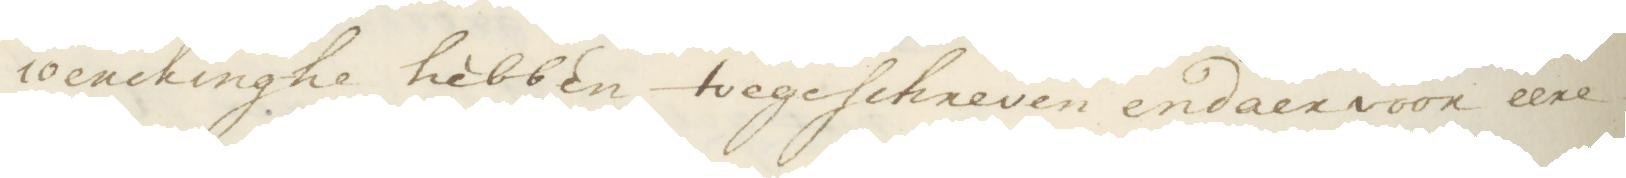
wenckinghe hebben toegeschreven en daer voor eere
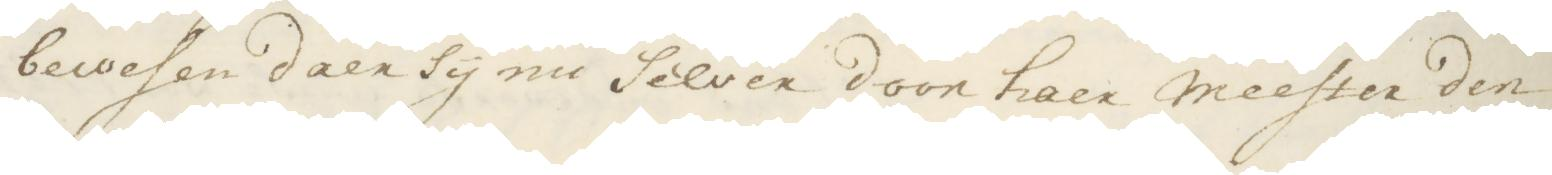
bewesen daer sij nu selver door haer meester den
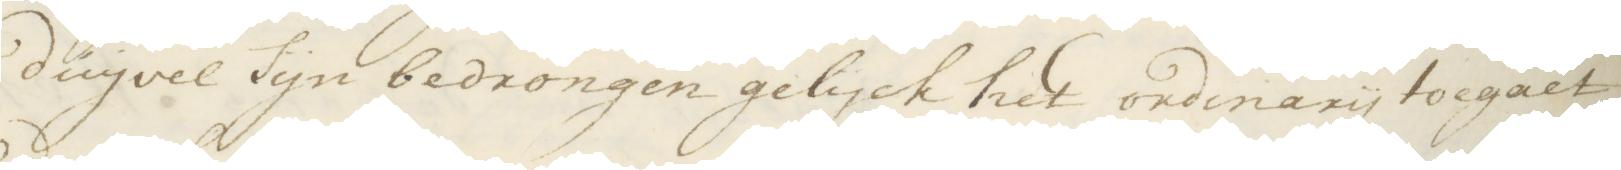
duijvel sijn bedrongen gelijck het ordinarij toegaet
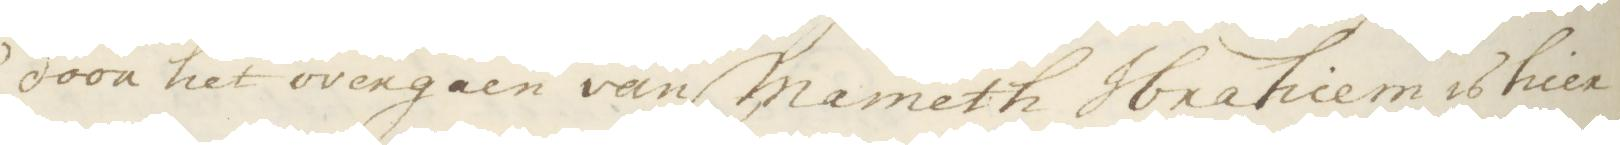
door het overgaen van Mameth Ibrahiem is hier
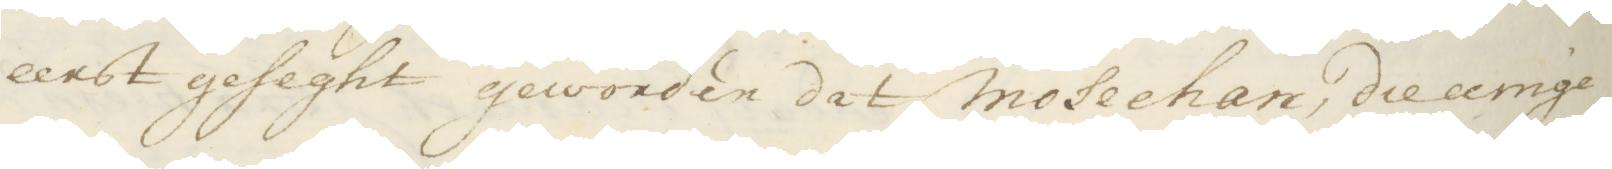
eerst geseght geworden dat Moseehar, die eenige
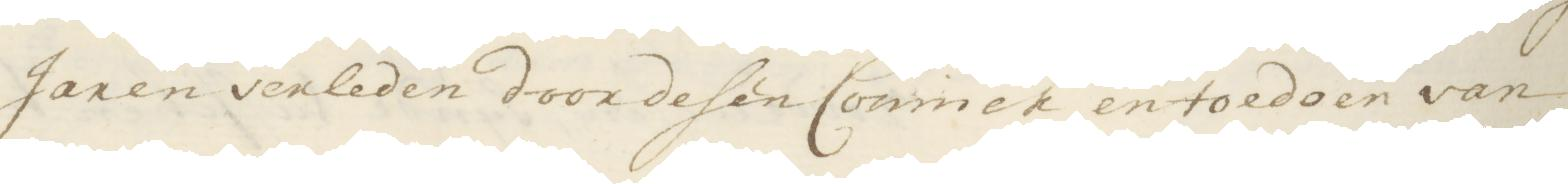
jaren verleden door desen Coninck en toedoen van
